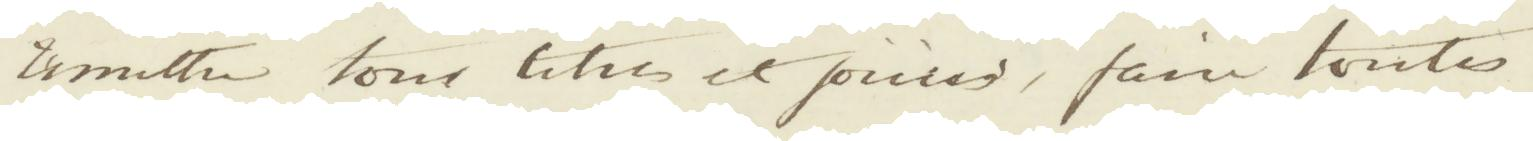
Remittre tous titres et jouies, faire toutes
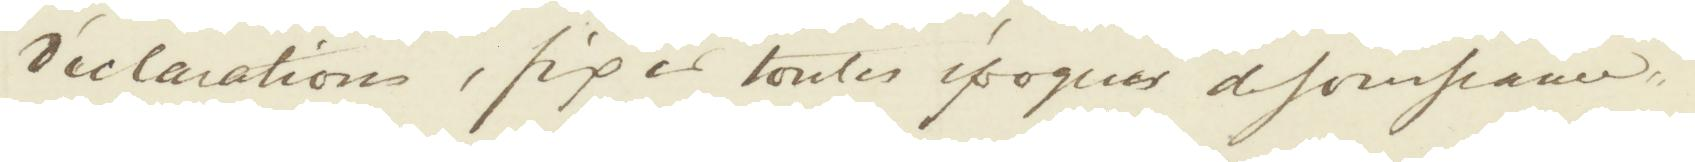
déclarations, fixer toutes époques de jours a ree„
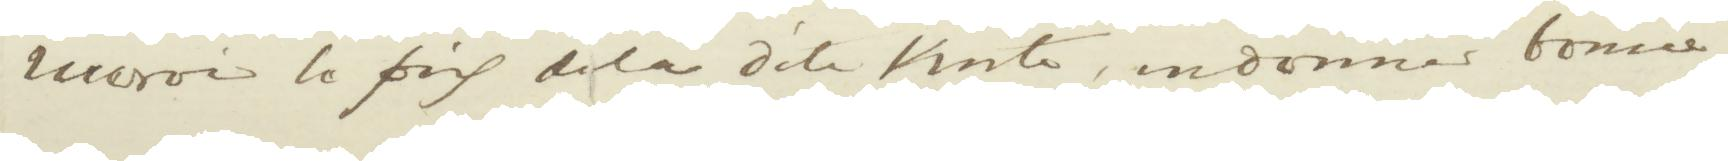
recevoi le prix de la dite Vente, en donner bonne
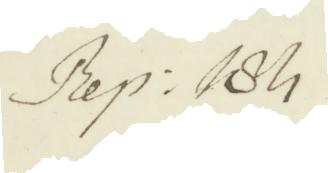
Rep: 184
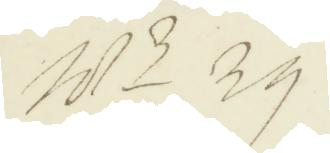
18 3 39
